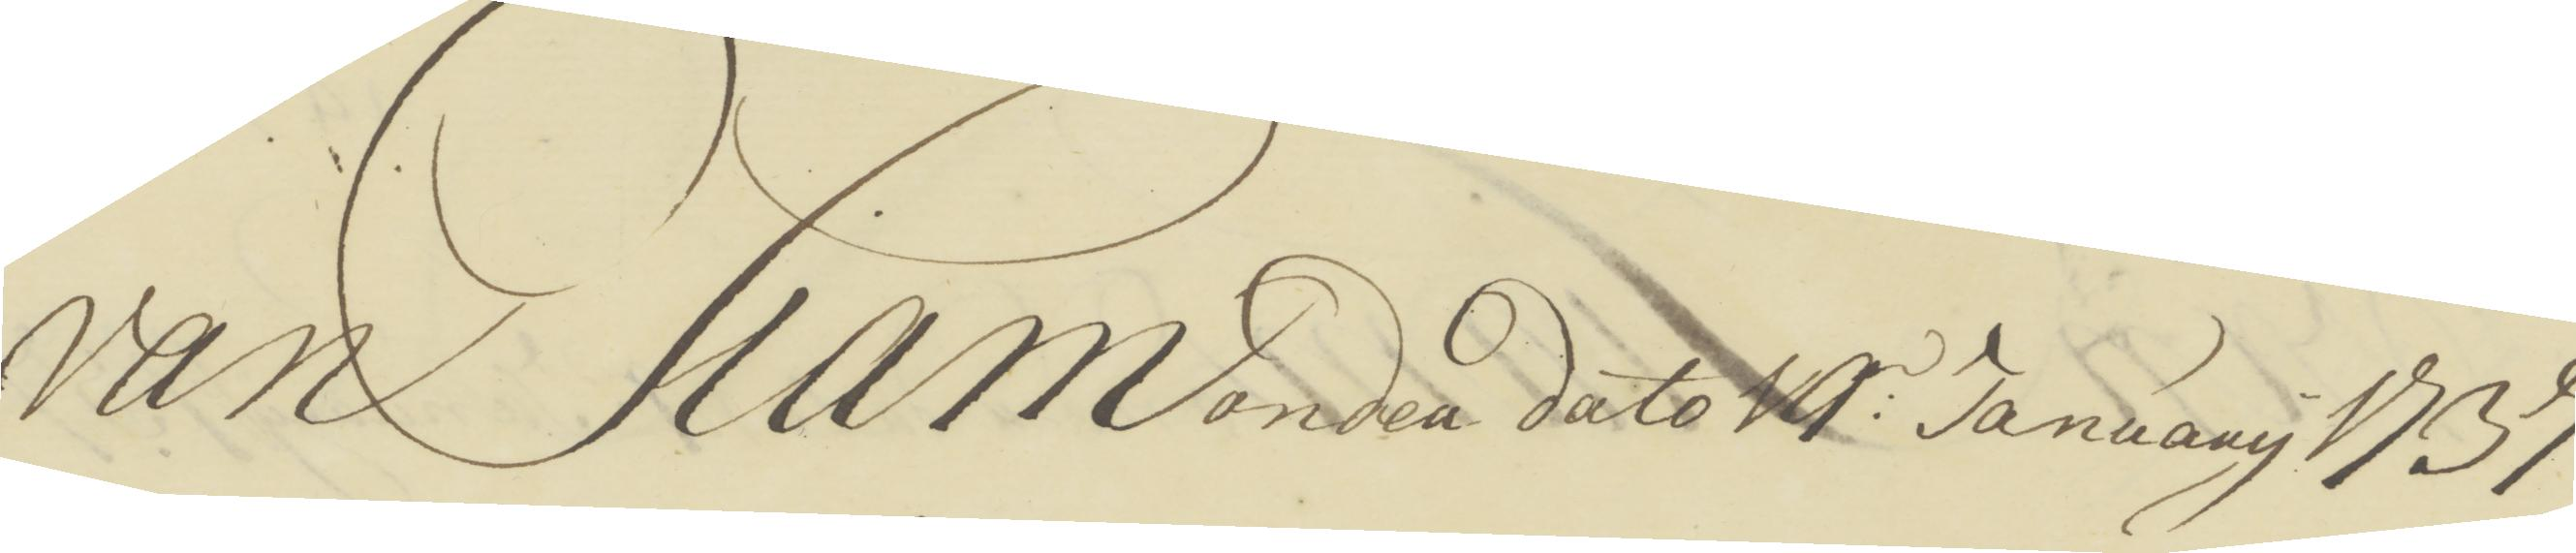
van Siam onder dato 19:' Januarij 1737
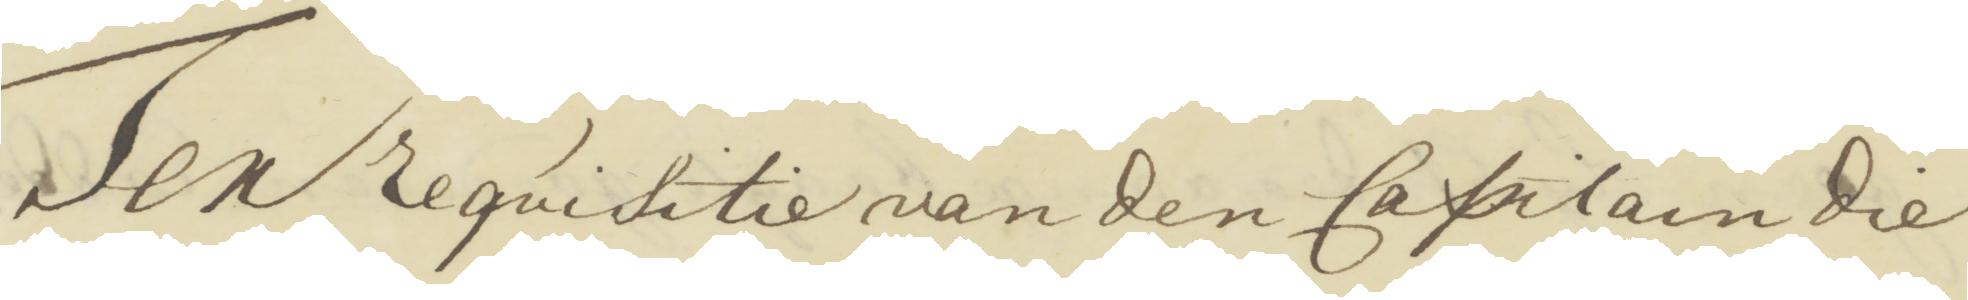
Ter requisitie van den Capitain die
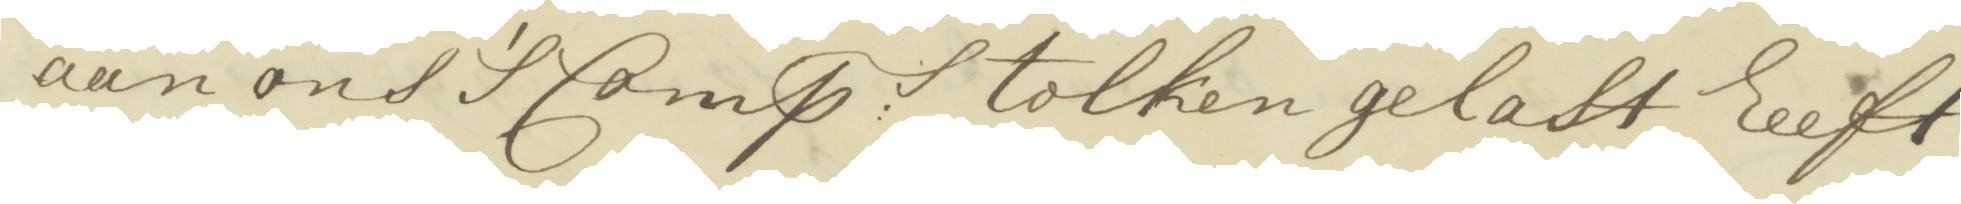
aan ons ’s Comp:s tolken gelast heeft
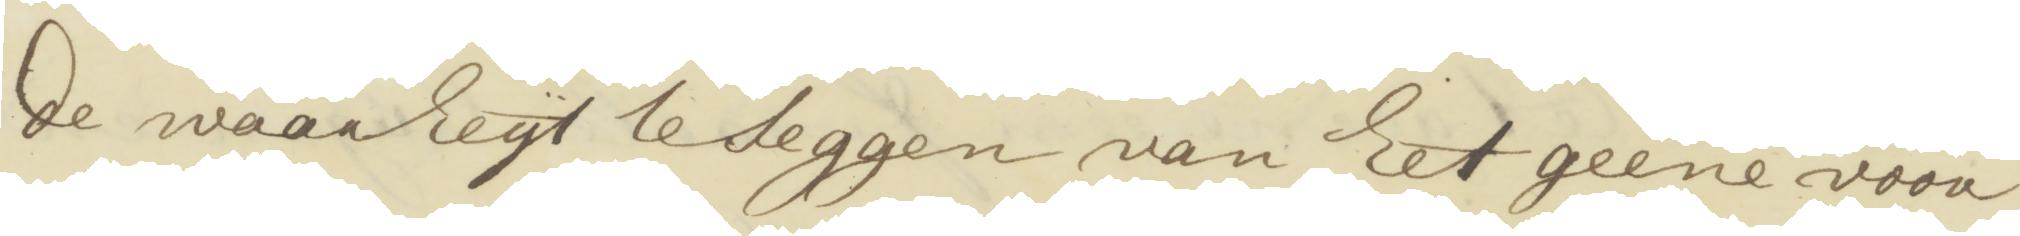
de waarheijt te seggen van het geene voor
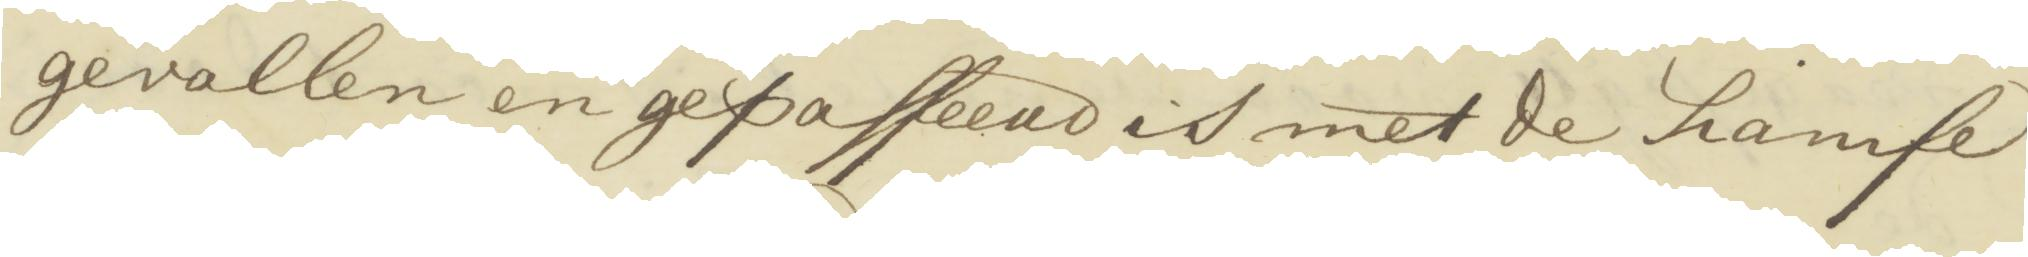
gevallen en gepasseerd is met de siamse
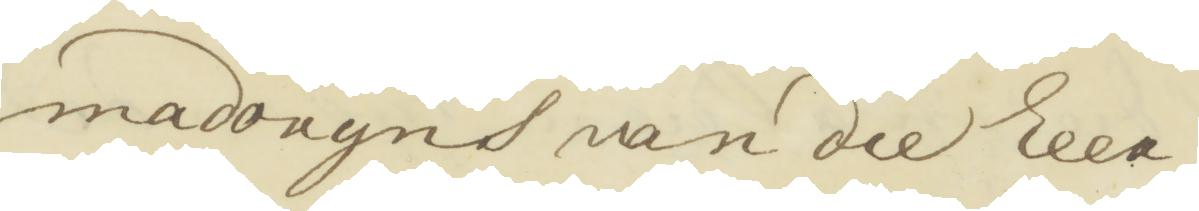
madarijns van die heer
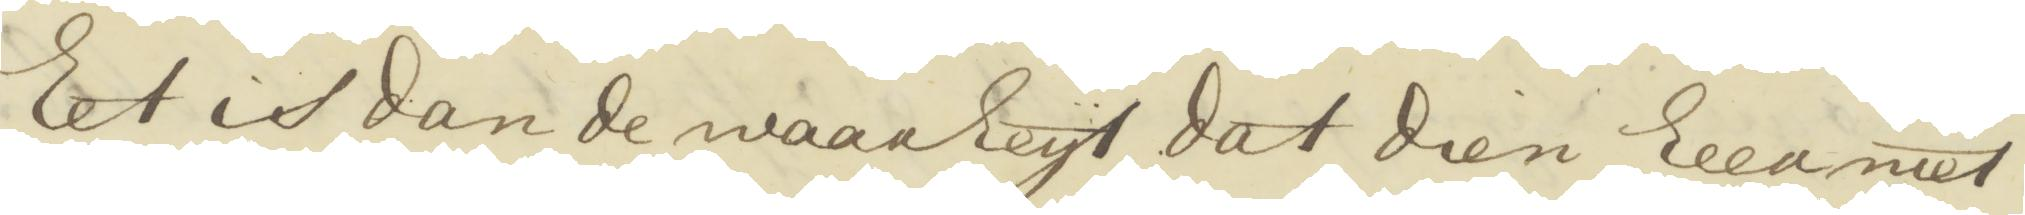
het is dan de waarheijt dat dien heer niet
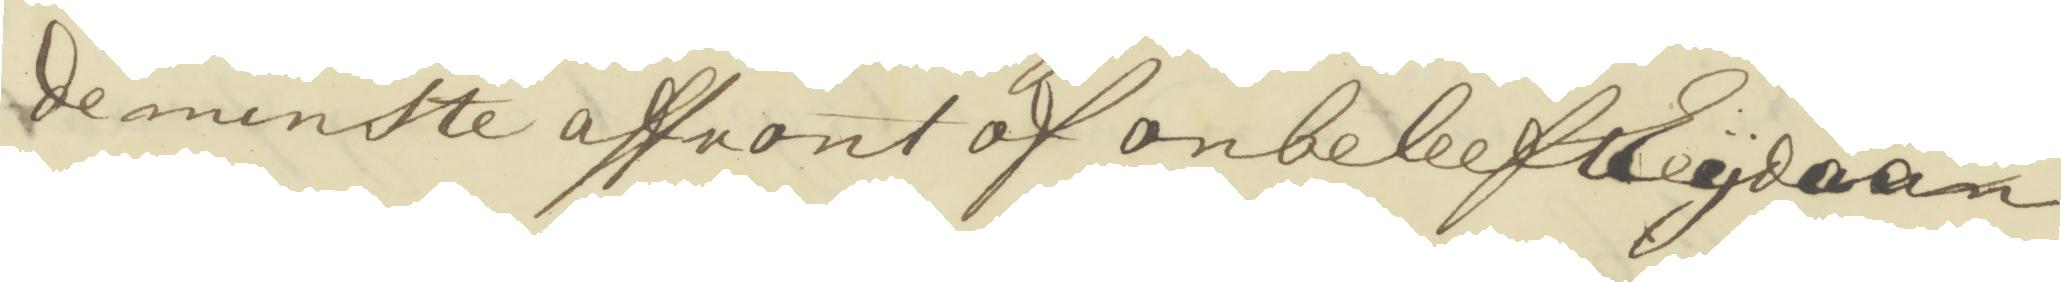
de minste affront of onbeleeftheijdaan
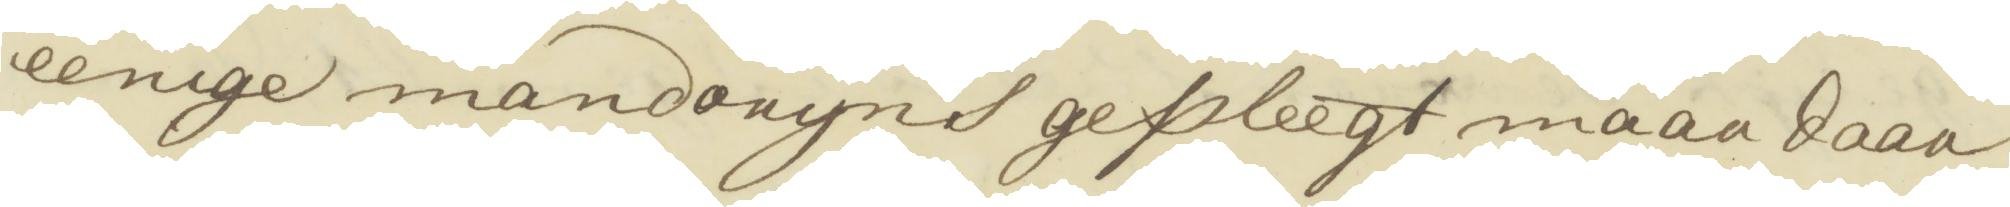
eenige mandarijns gepleegt maar daar
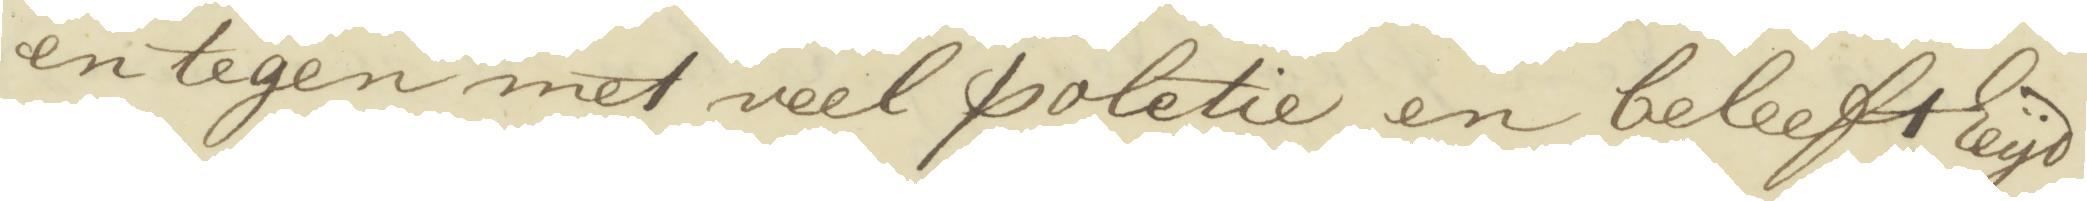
en tegen met veel poletie en beleeftheijd
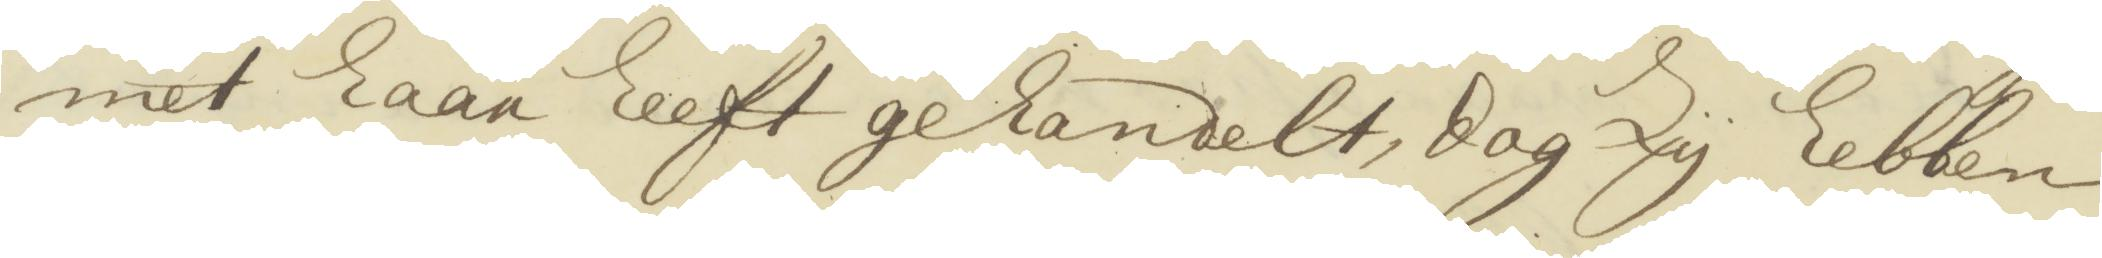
met haar heeft gehandelt, dog Zij hebben
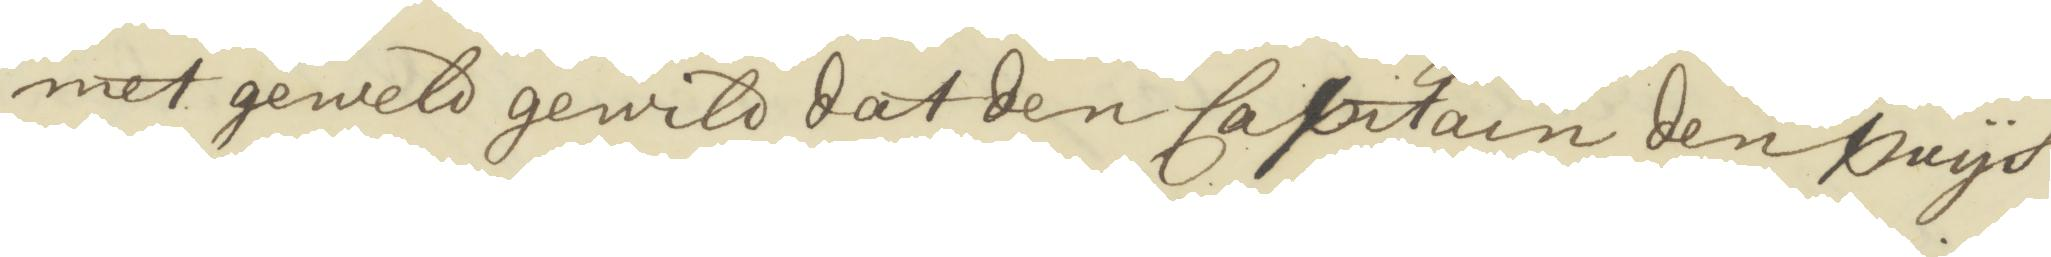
met geweld gewild dat den Capitain den prijs
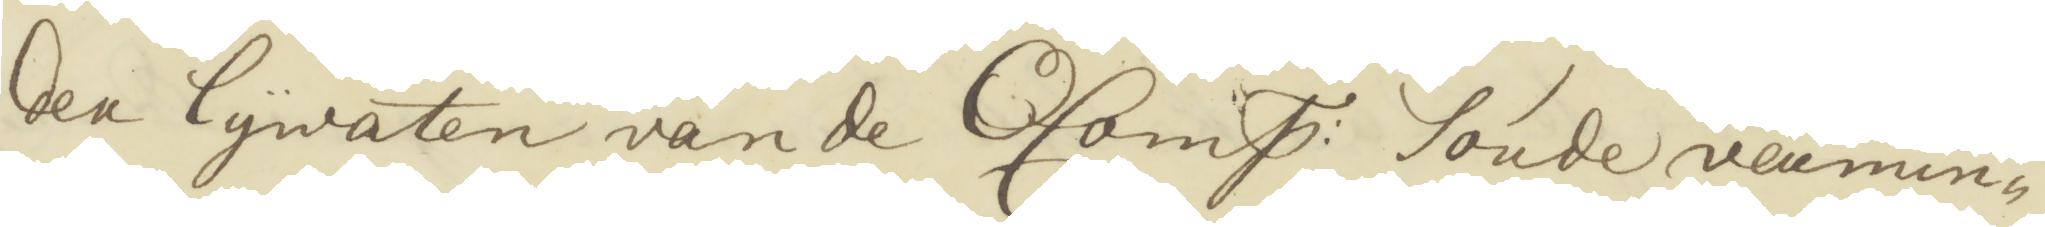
der lijwaten van de Comp: soude vermin„
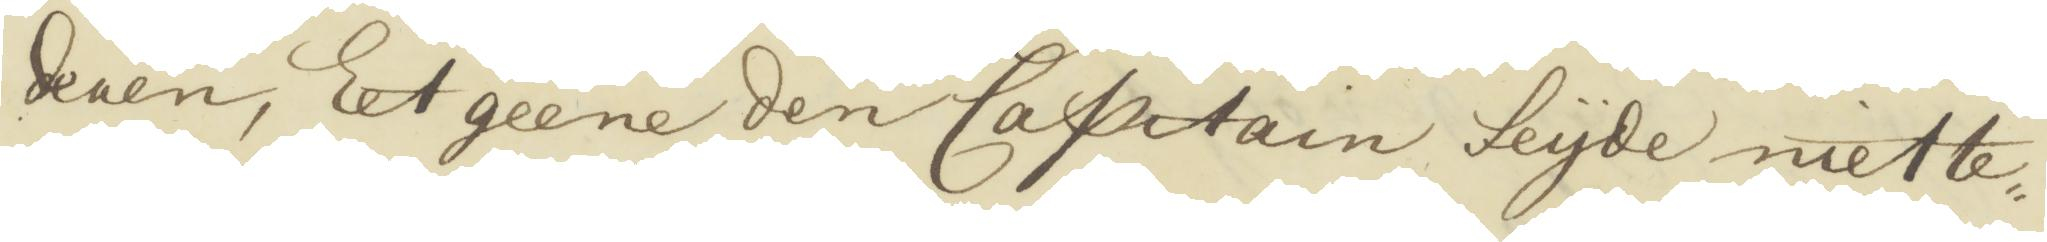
deren, het geene den Capitain seijde niet te„
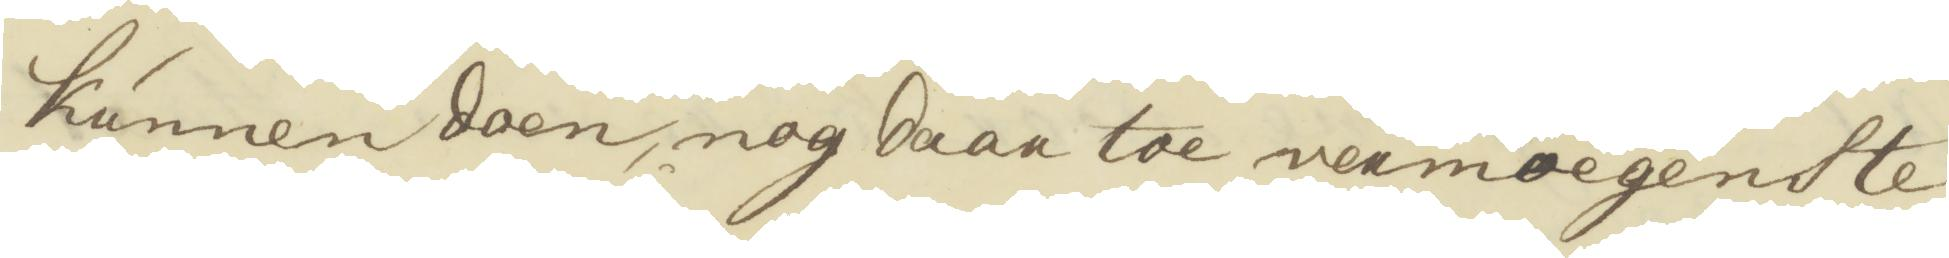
kunnen doen, nog daar toe vermoegens te
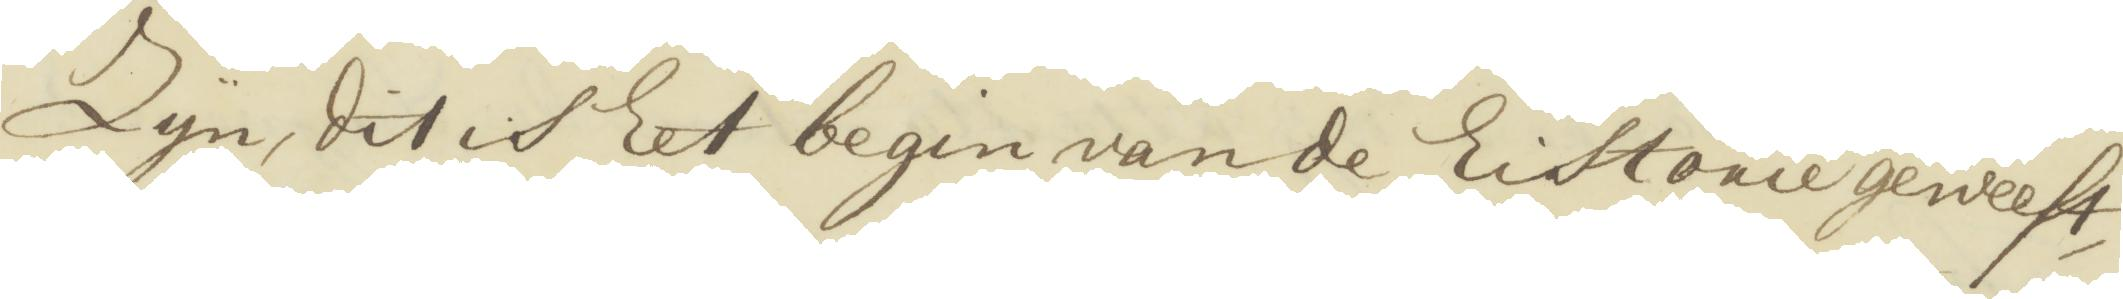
Zijn, dit is het begin van de historie geweest
